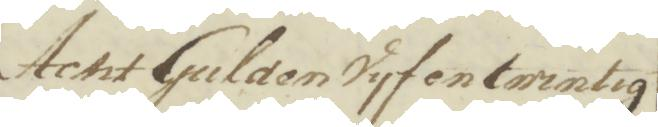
Acht Gulden Vyf en twintig
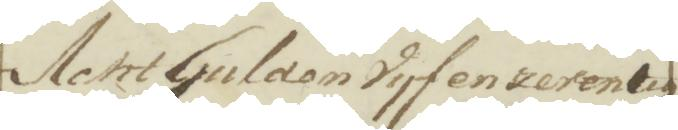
Acht Gulden Vyf en zeventig
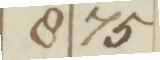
8 75
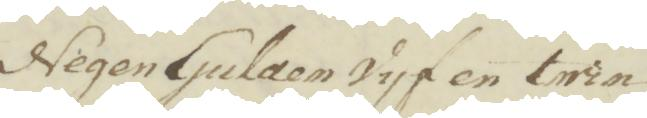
Negen Gulden Vyf en twin
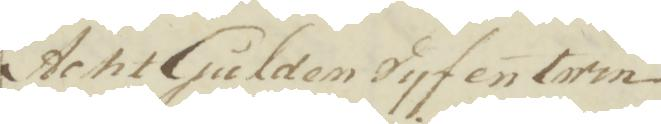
Acht Gulden Vyf en twin
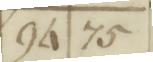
94 75
